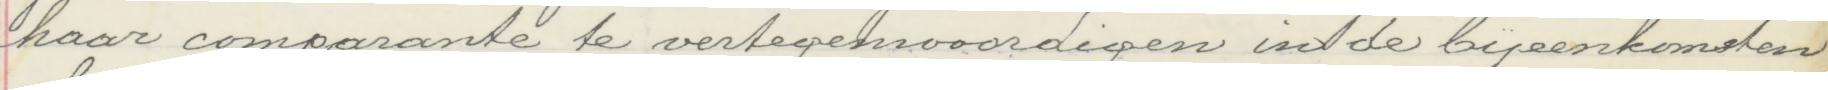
haar comparante te vertegenwoordigen in de bijeenkomsten
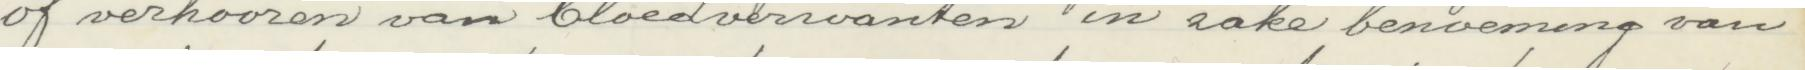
of verhooren van bloedverwanten in zake benoeming van
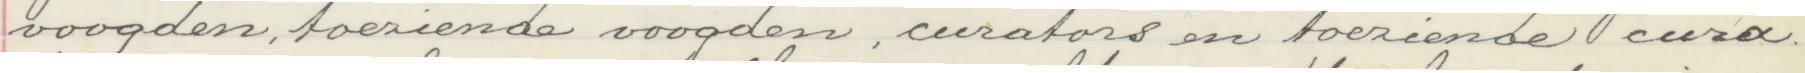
voogden, toeziende voogden, curators en toeziende cura
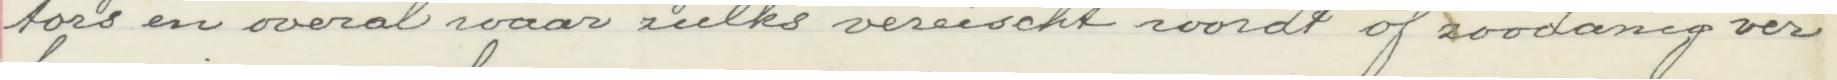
tors en overal waar zulks vereischt wordt of zoodanig ver
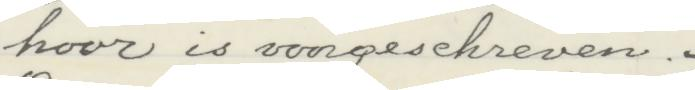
hoor is voorgeschreven.
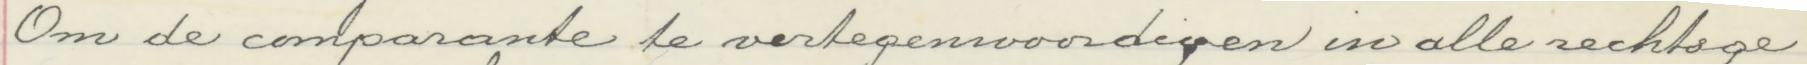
Om de comparante te vertegenwoordigen in alle rechtsge
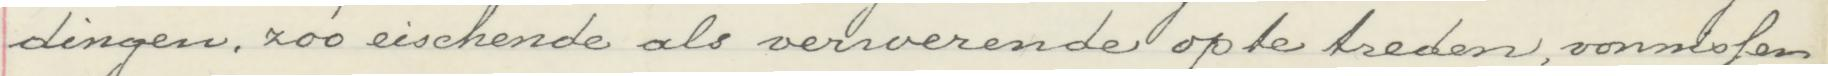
dingen, zoo eischende als verroerende op te treden, vonnissen
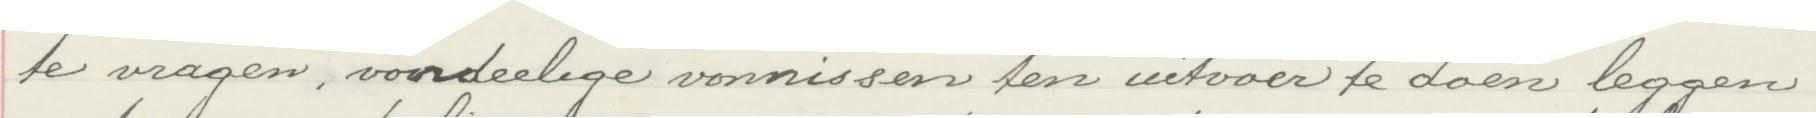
te vragen, voordeelige vonnissen ten uitvoer te doen leggen
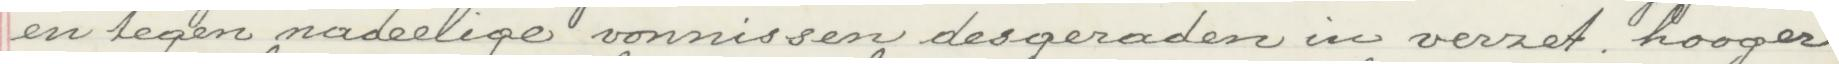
en tegen nadeelige vonnissen desgeraden in verzet. hooger
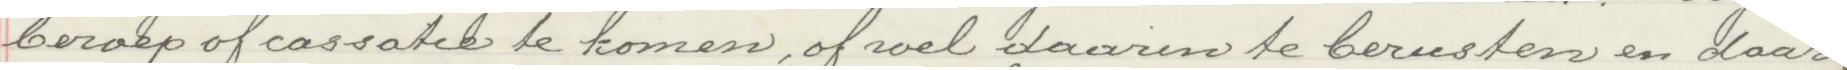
beroep of cassatie te komen, of wel daarin te berusten en daar
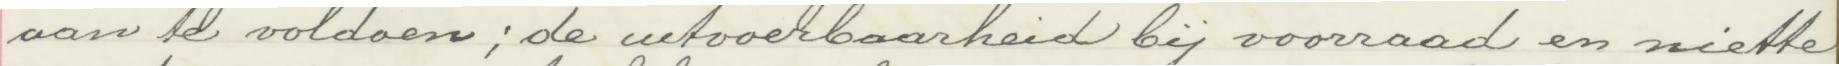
aan te voldoen; de uitvoerbaarheid bij voorraad en niette
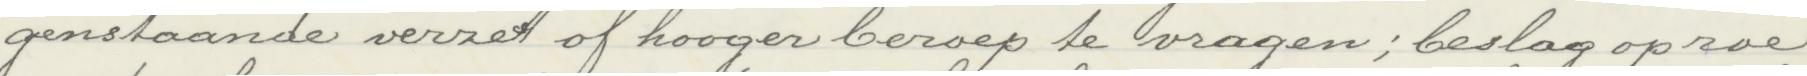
genstaande verzet of hooger beroep te vragen; beslag op roe
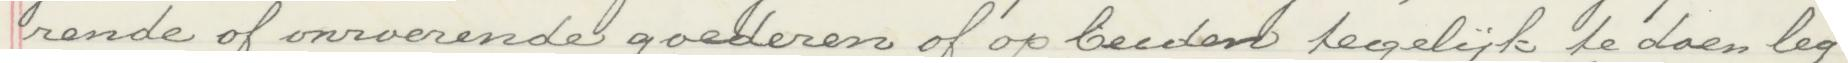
rende of onroerende goederen of op beiden tegelijk te doen leg
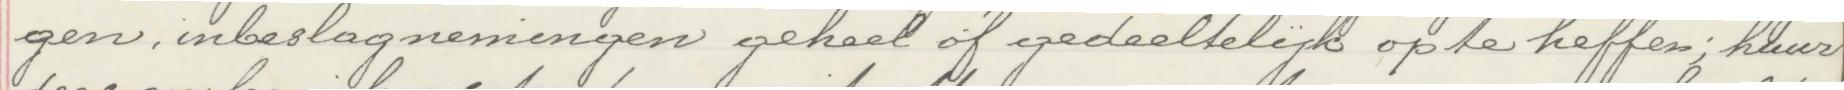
gen, inbeslagnemingen geheel of gedeeltelijk op te heffen; huur
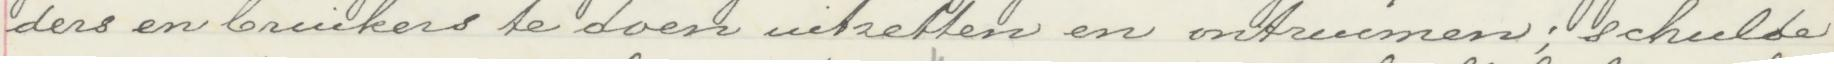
ders en bruikers te doen uitzetten en ontruimen; schulde
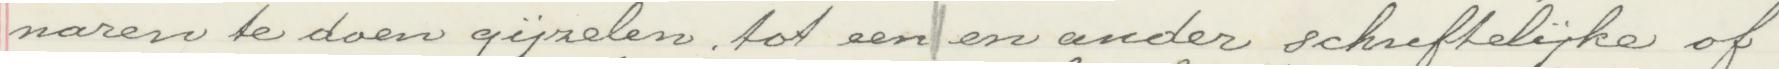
naren te doen gijzelen, tot een en ander schriftelijke of
